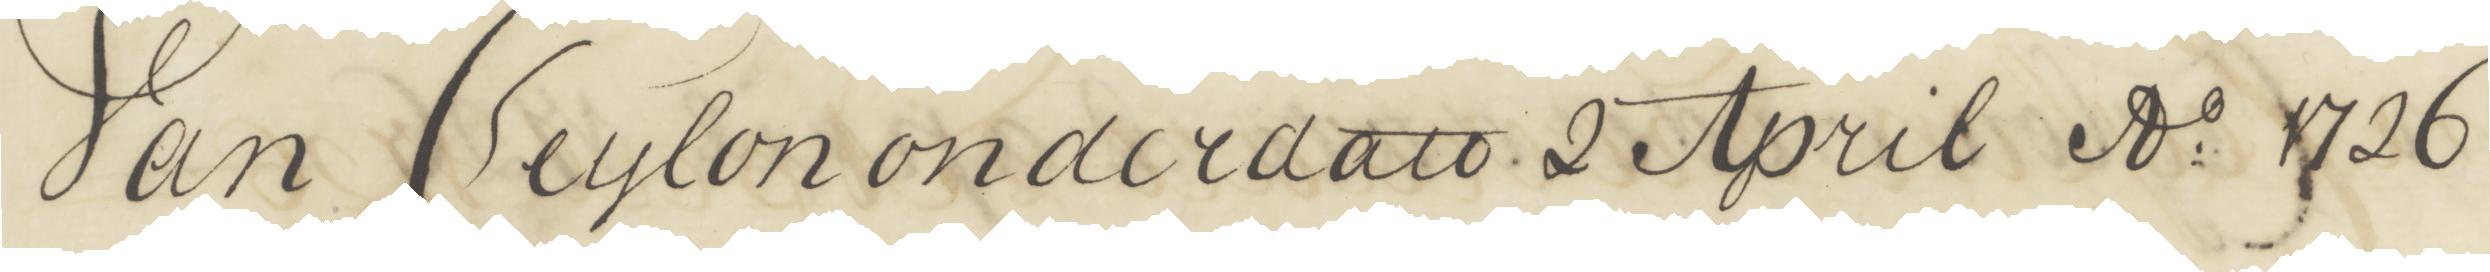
Van Ceijlon onder dato 2 April A:o 1726
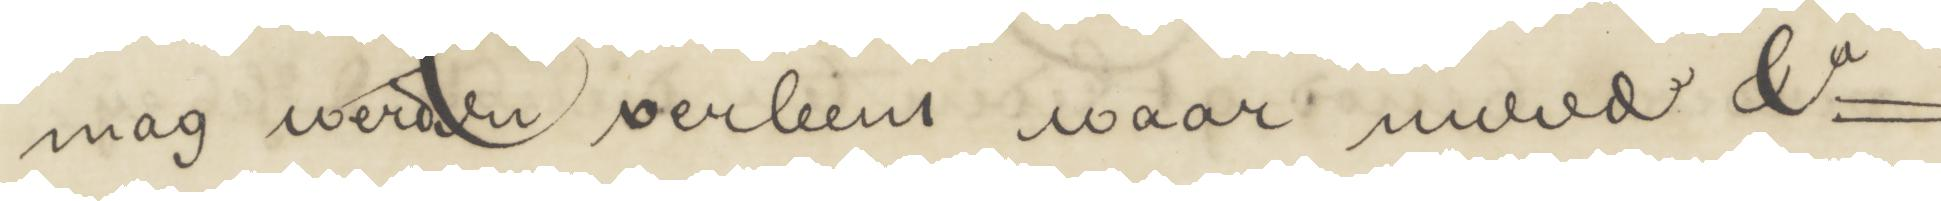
mag werden verleent waar meede &=a
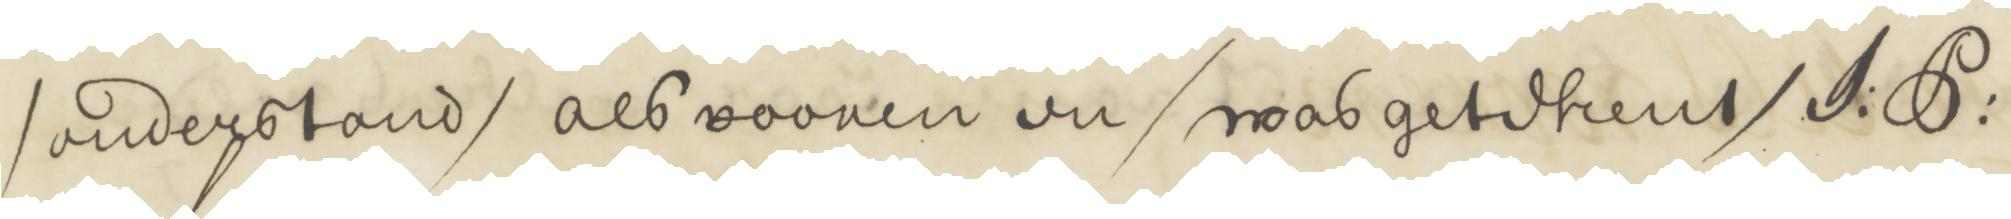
/onderstond/ als vooren en / was getekent/ I: P:
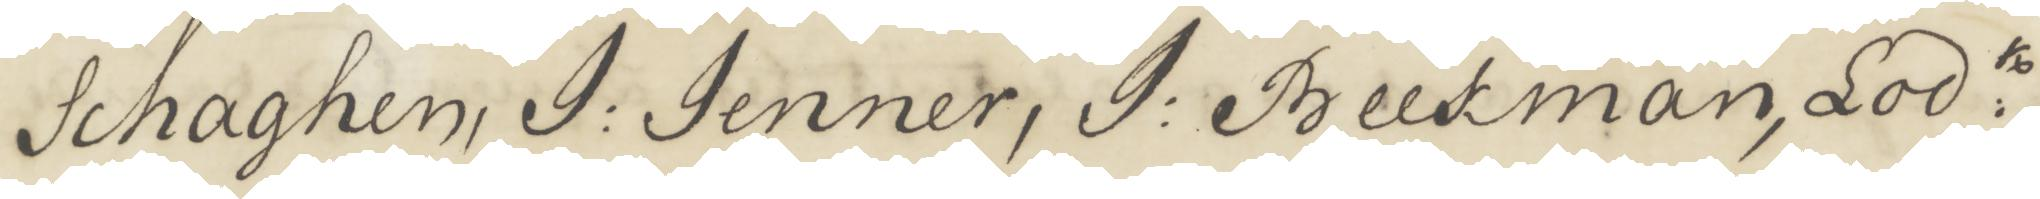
Schaghen, I: Jenner, I: Beekman, Lod:k
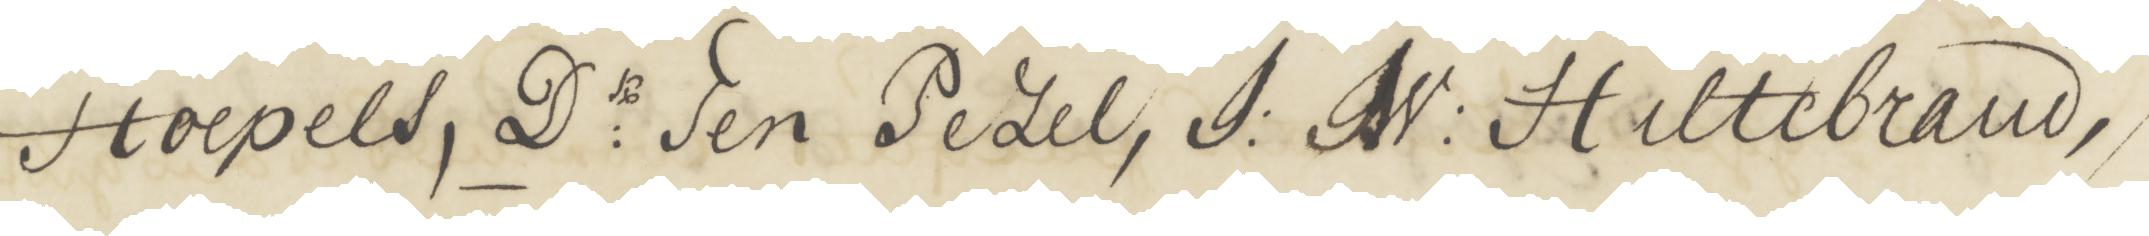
Hoepels, D:k Ten Pezel, J: W: Hiltebrand,
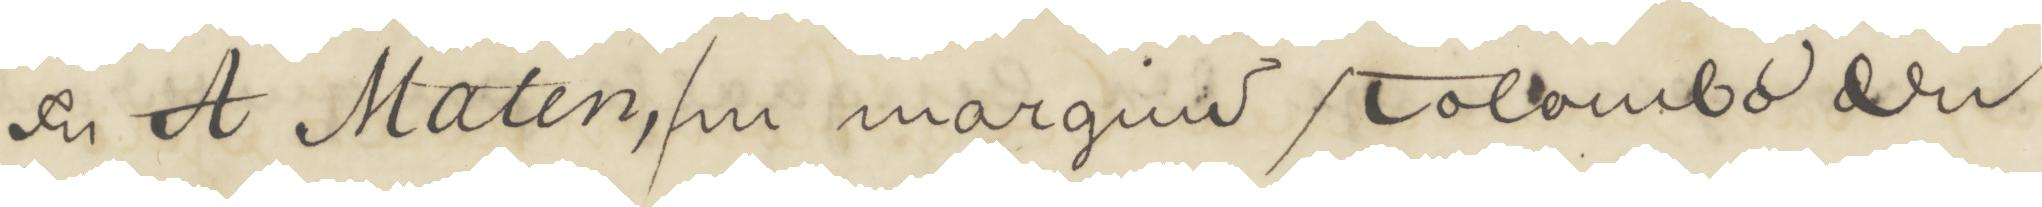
En A Maten, /in margine / Colombo den
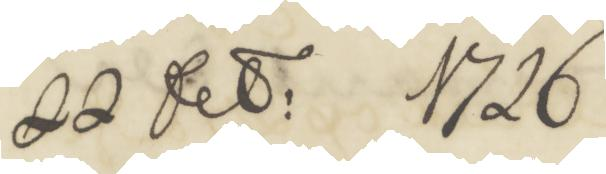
22 feb: 1726
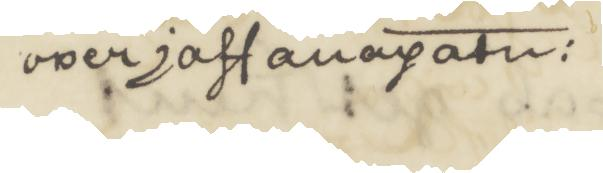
over jaffanapatn:
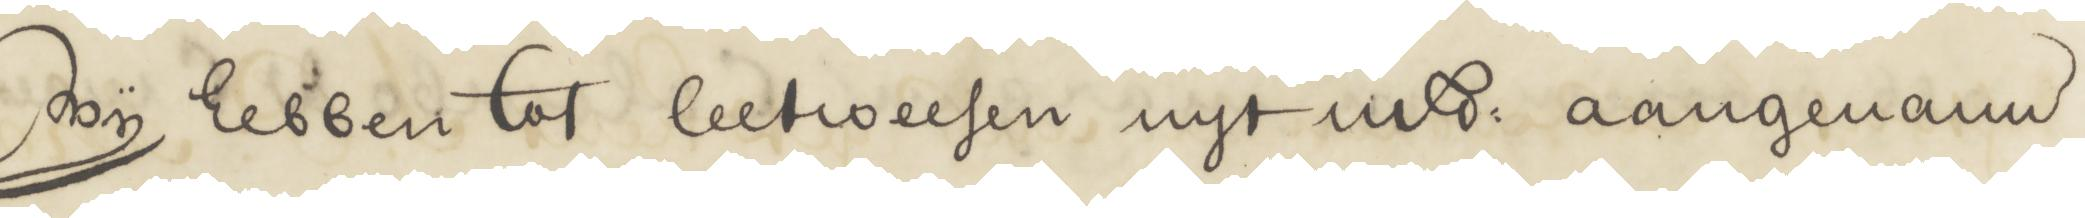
Wij hebben tot leetweesen uijt uEd: aangename
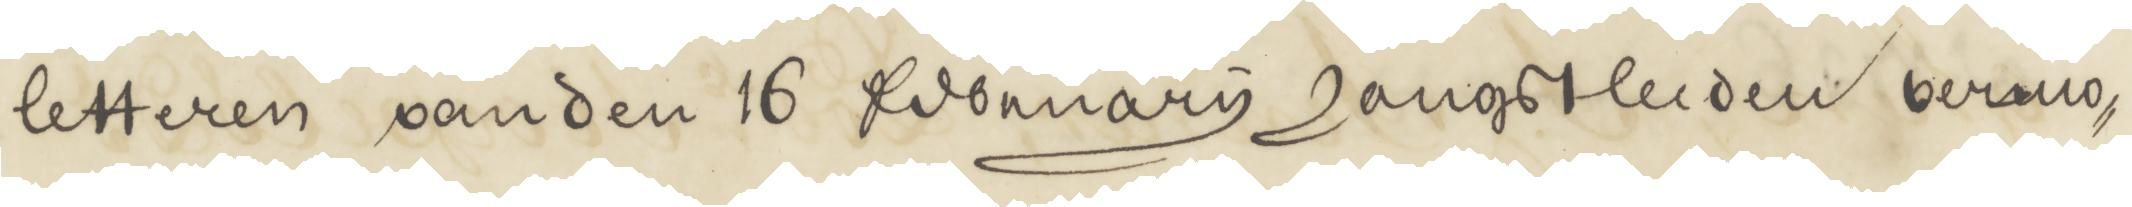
letteren van den 16 februarij Jongstleeden verno„
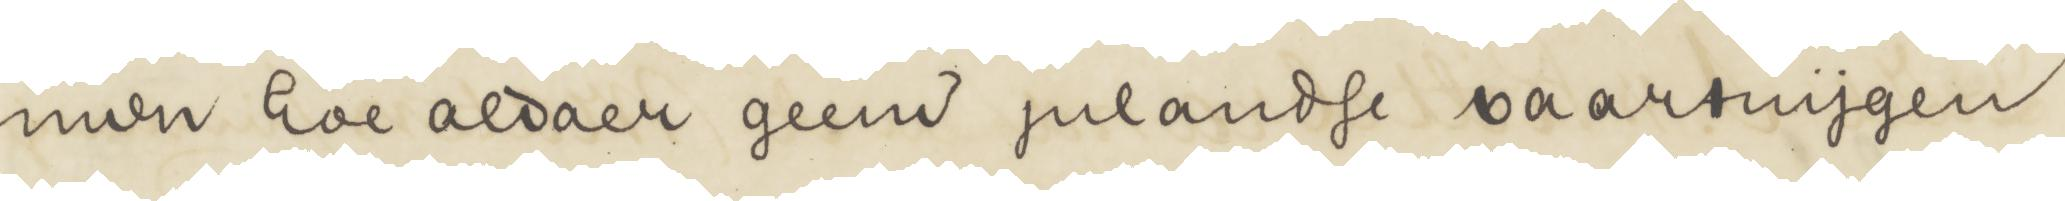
men hoe aldaer geene jnlandse vaartuijgen
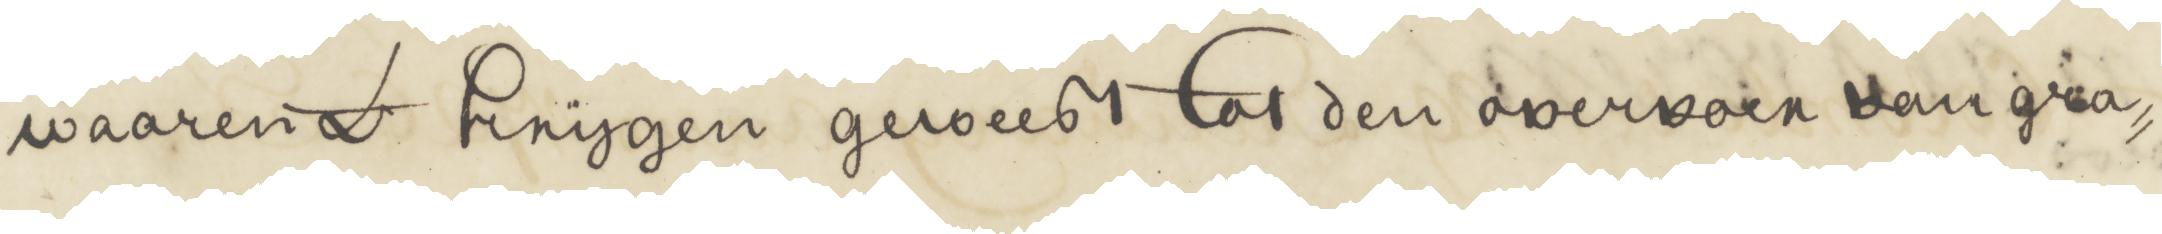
waaren te krijgen geweest tot den overvoer van gra„
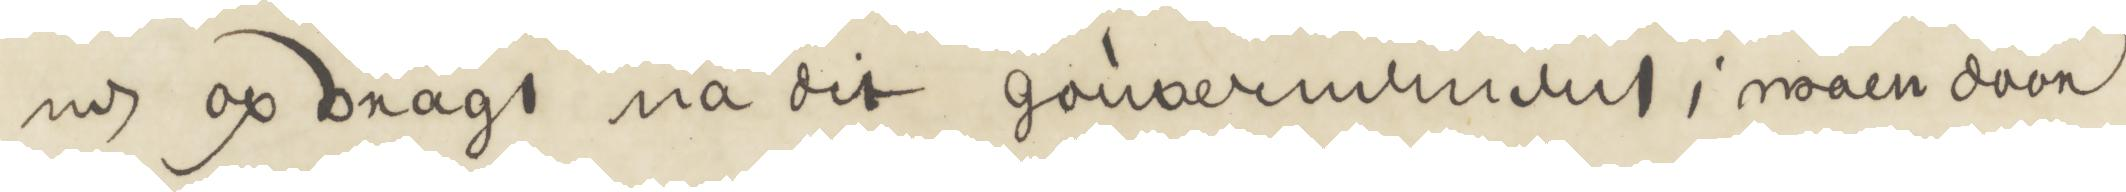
nen op vragt na dit gouvernement; waer door
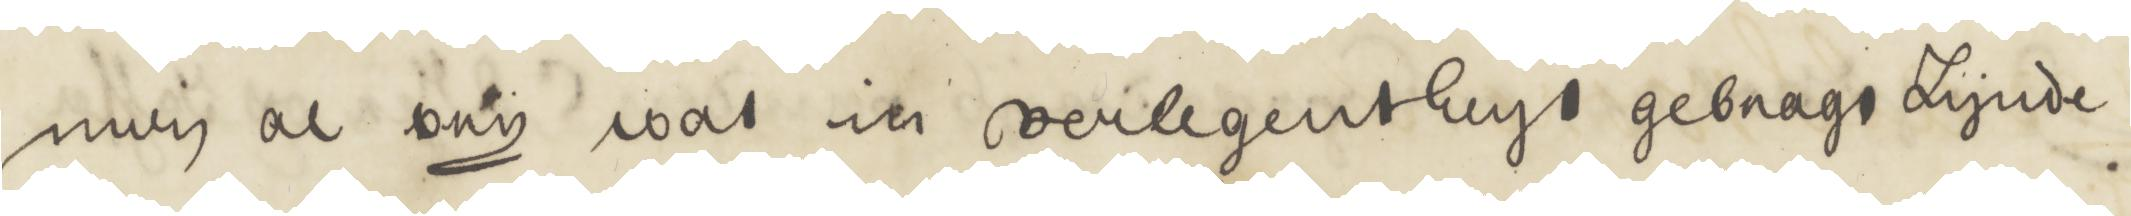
men al vrij wat in verlegentheyt gebragt zijnde
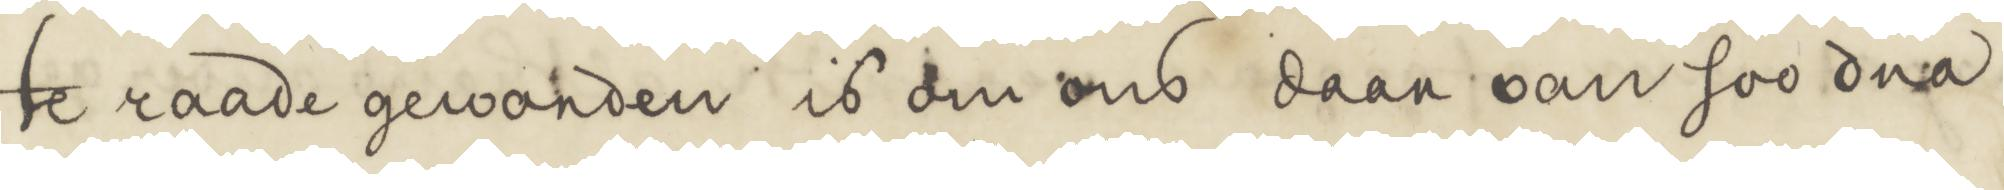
te raade geworden is om ons daar van soo dra
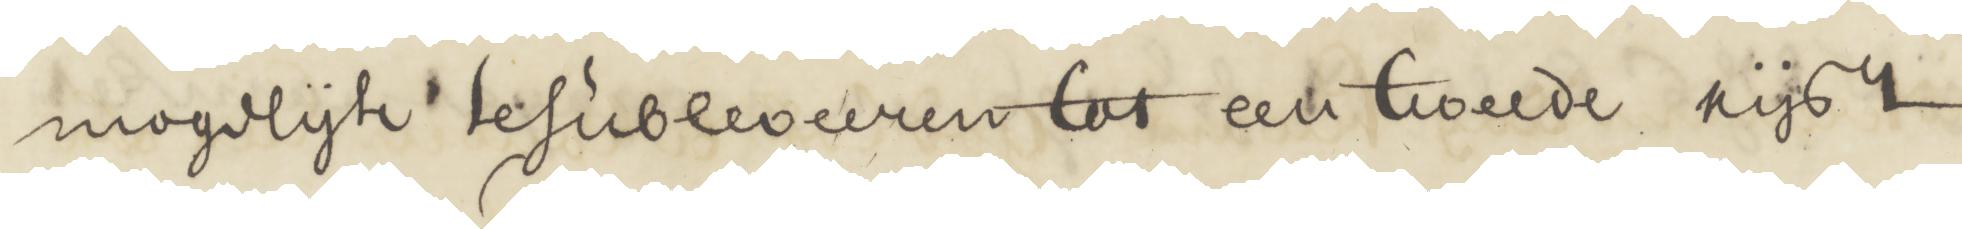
mogelijk te subleveeren tot een tweede rijst
